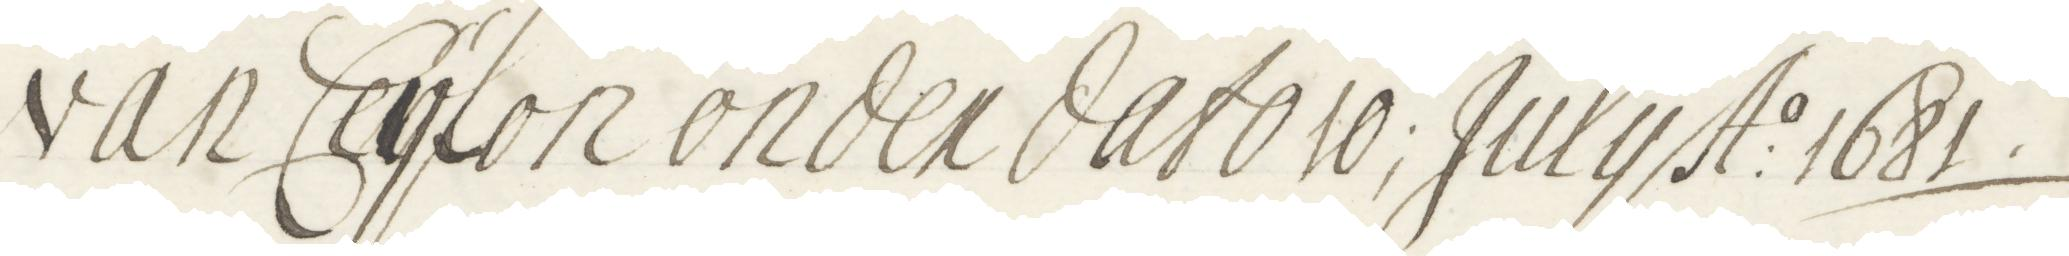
van Ceijlon onder dato 10;e Julij A:o 1681.
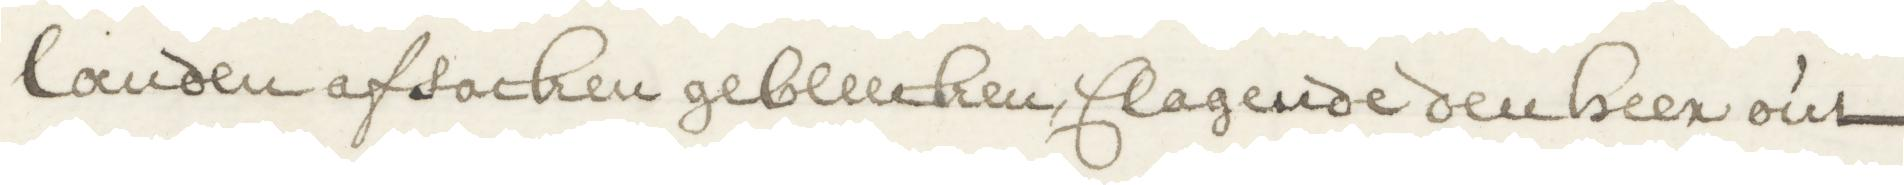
landen afsacken gebleecken, Clagende den heer out
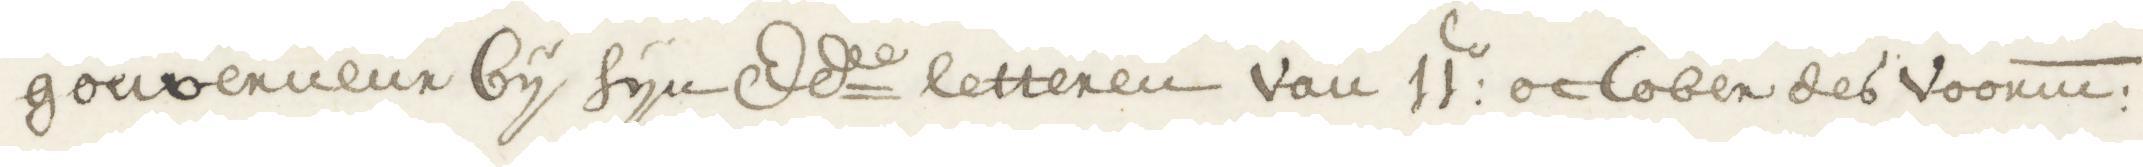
gouverneur bij sijn Ed=le letteren van 11:e october des Voorm:
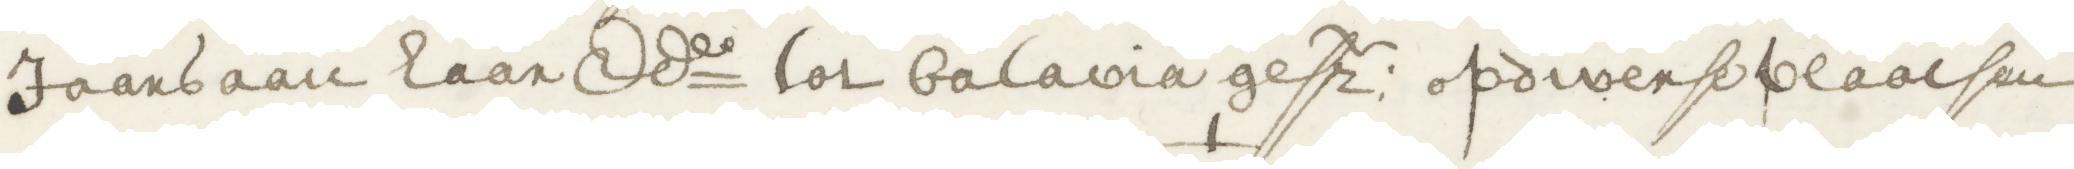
Jaars aan haar Ed=le tot batavia gesz: op diverse plaatsen
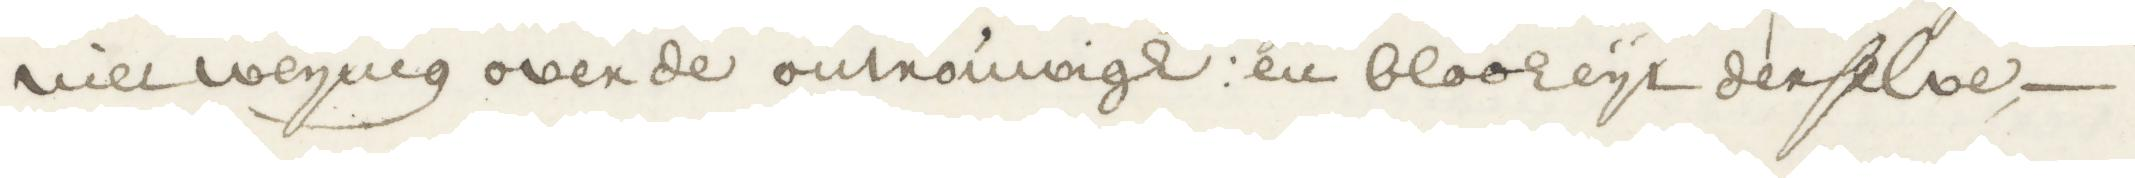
niet weijnig over de ontrouwigh:t en blooheijt derselve, —
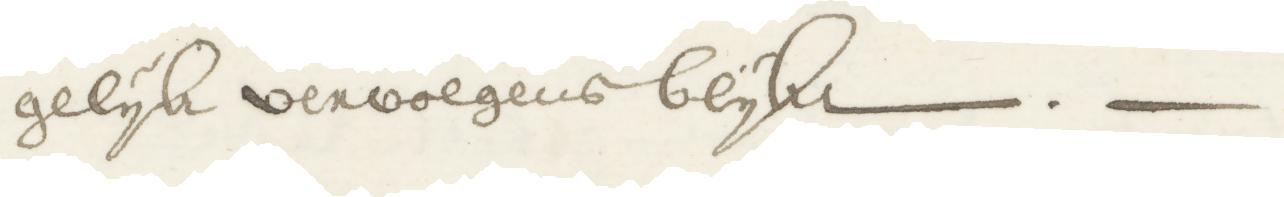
gelijk vervolgens blijkt. —
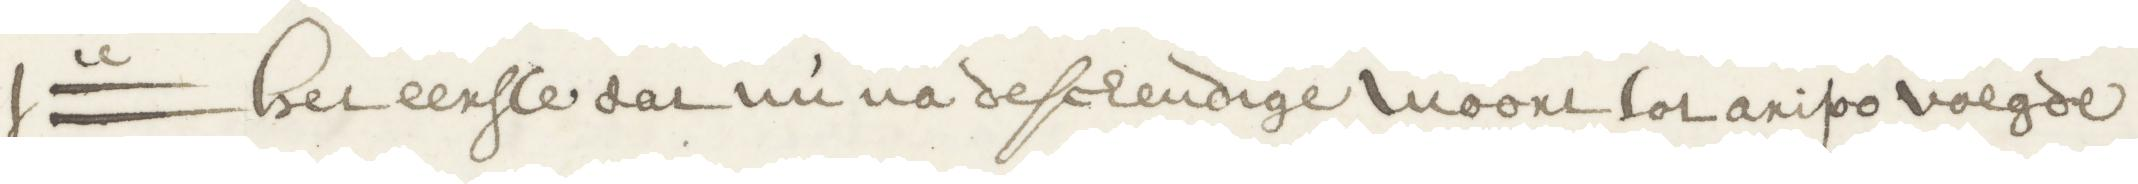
1=ie het eerste dat nu na de schendige moort tot aripo volgde
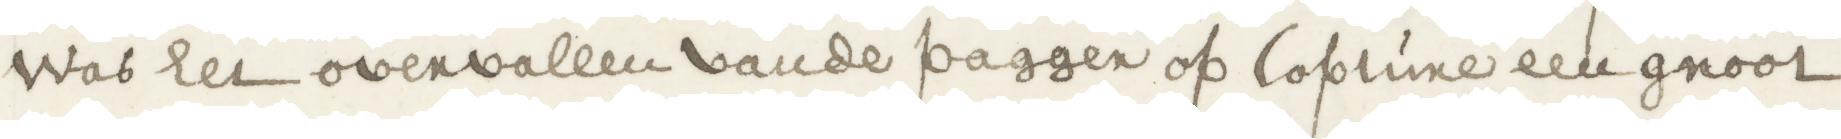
was het overvallen vande pagger op topture een groot
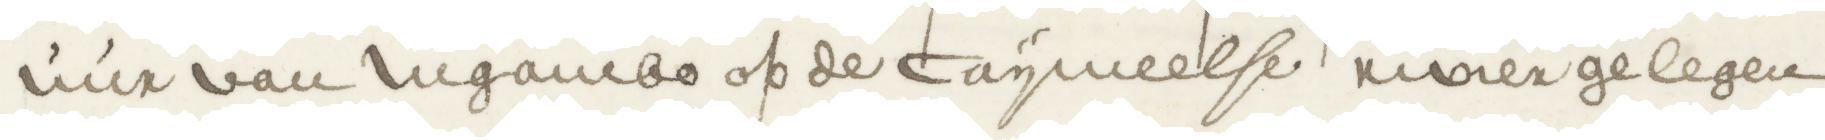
uur van nigambo op de caijmeelse rivier gelegen
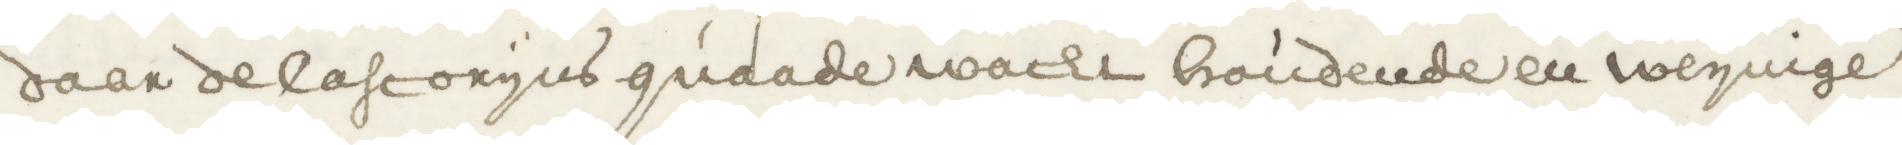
daar de lascorijns quaade wacht houdende en weijnige
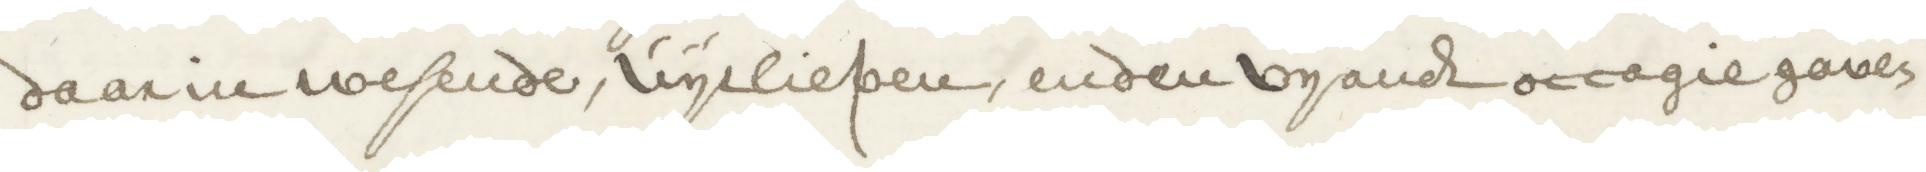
daar in wesende, uijtliepen, enden vijandt occagie gaven
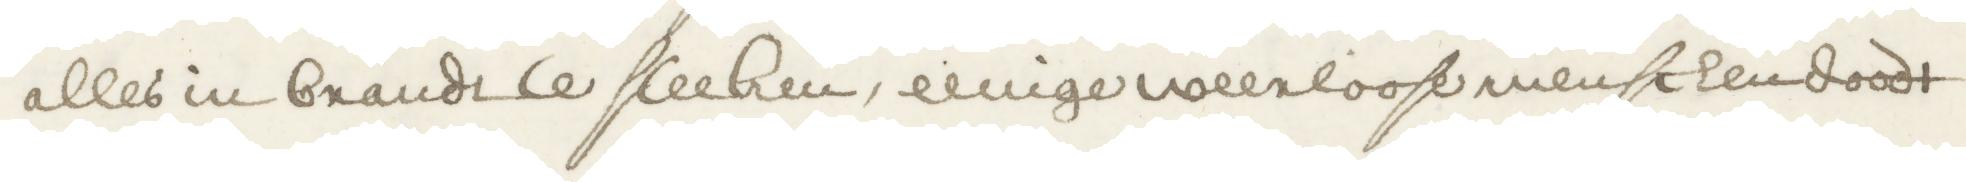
alles in brandt te steeken, eenige weerloose menschen doodt
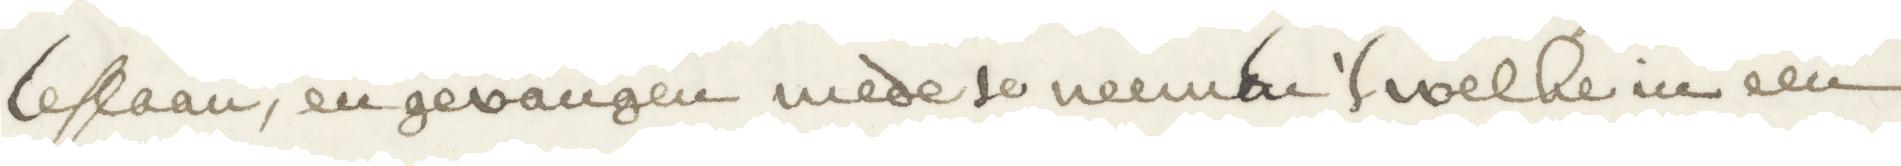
teslaan, en gevangen mede te neemen ’t welke in een
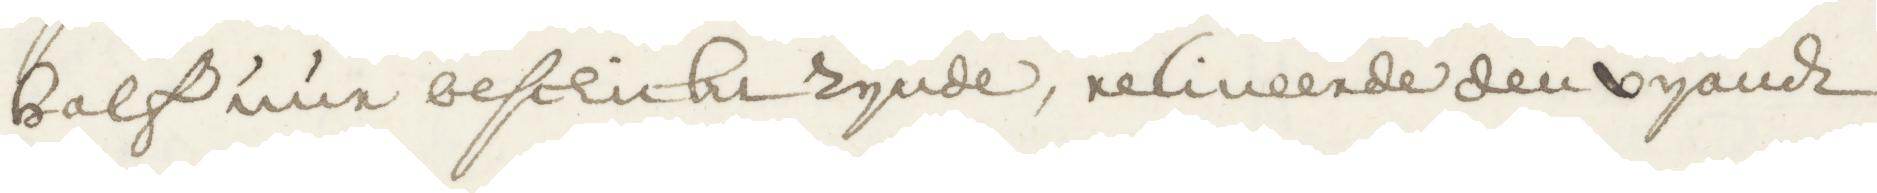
half uur beschickt zijnde, retineerde den vijandt
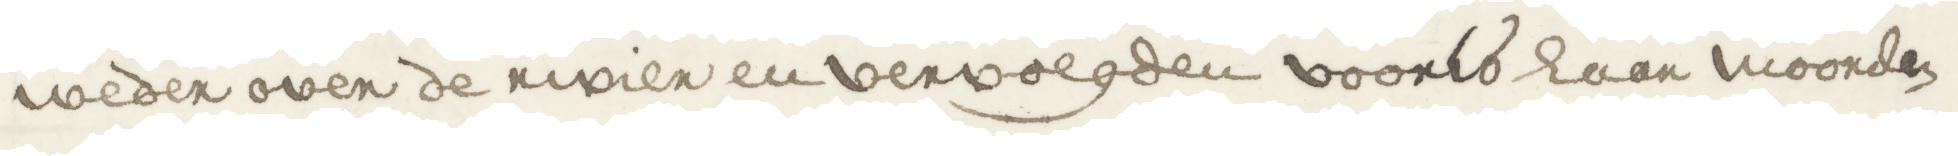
weder over de rivier en vervolgden voorts haar moorden
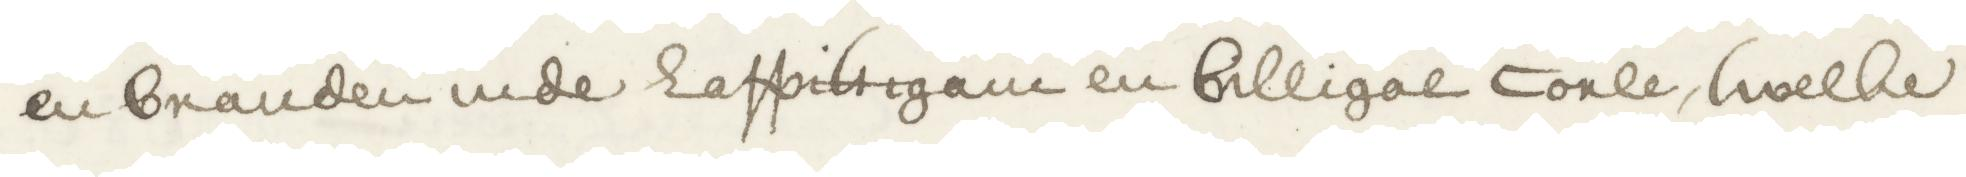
en branden inde happittigam en billigal corle, twelke
